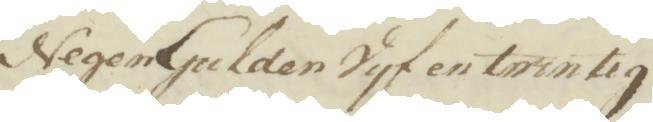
Negen Gulden Vyf en twintig
